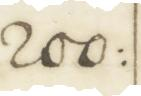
200:
